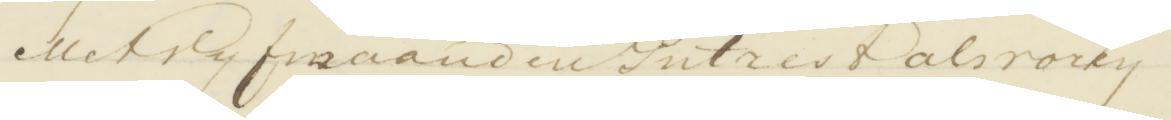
Met Vyf maanden Intrest als voren
